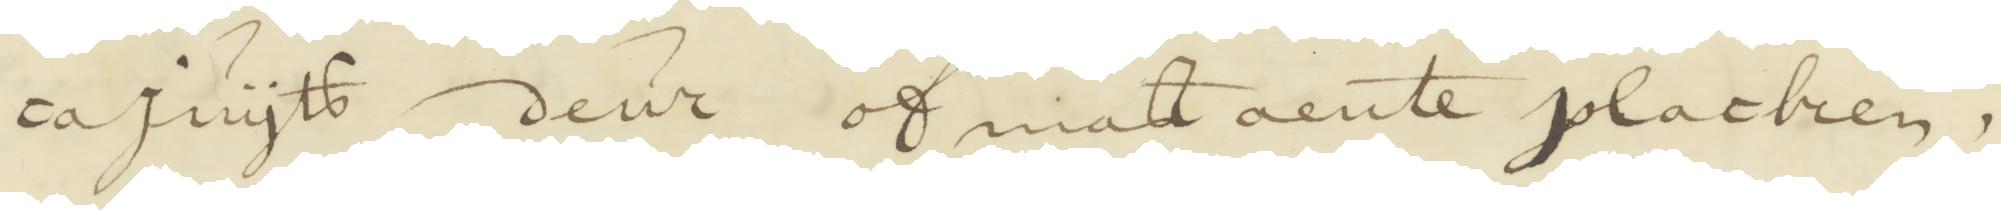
cajuijts deur of mast aente placken,
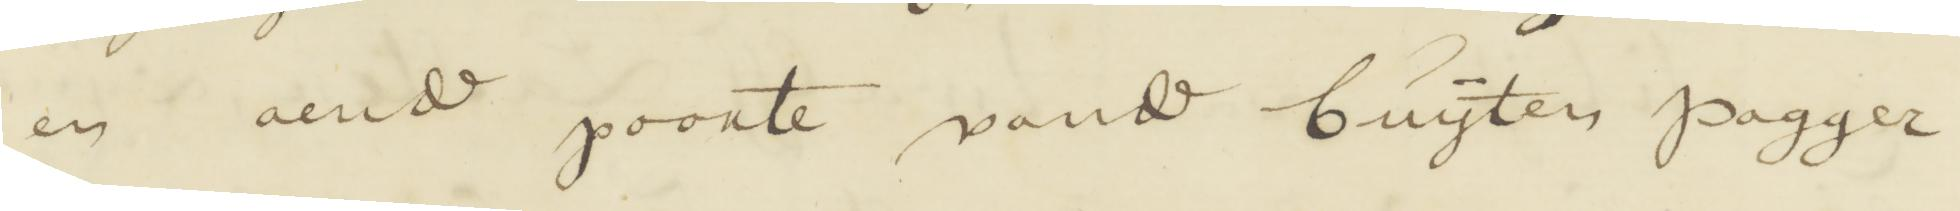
en aende poorte vande buijten pagger
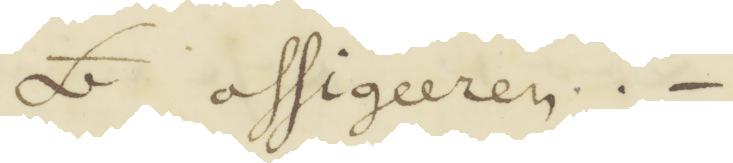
te affigeeren —
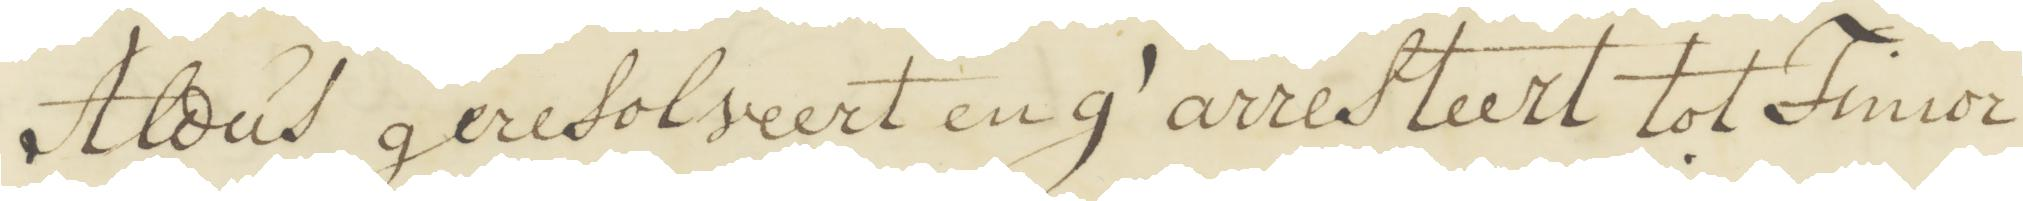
Aldus geresolveert en g’ arresteert tot Timor
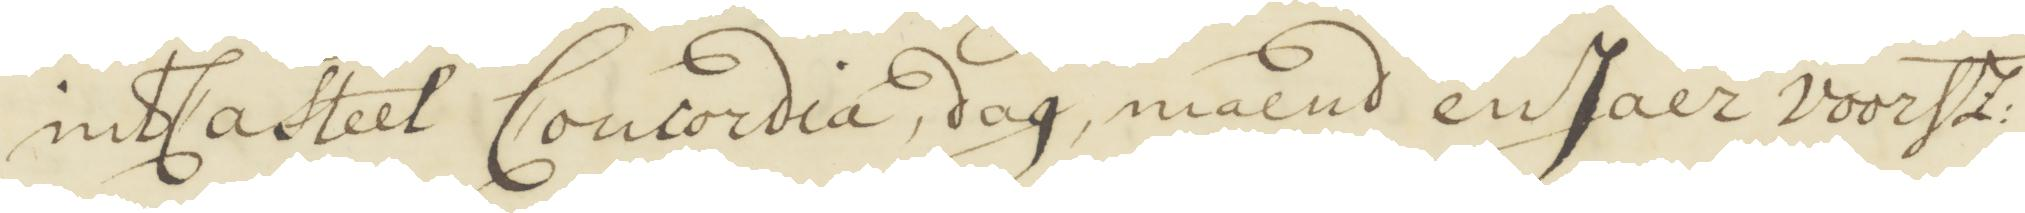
in'tCasteel Concordia, dag, maend en Jaer voorsz:
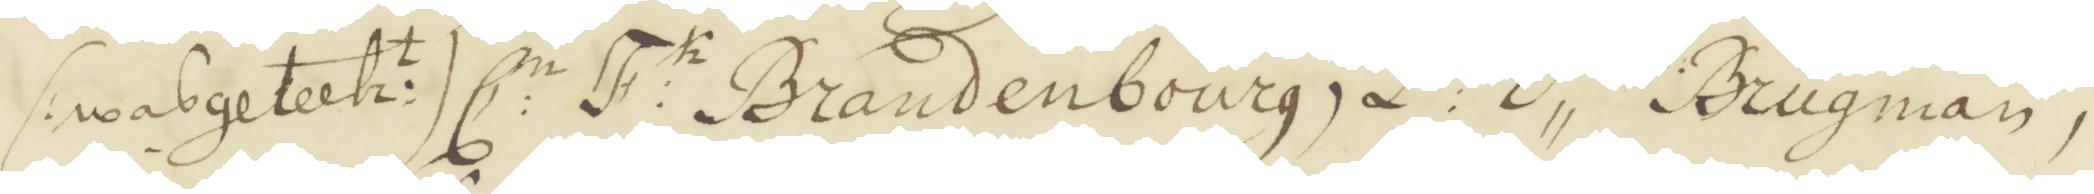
(:was geteek:t) C:n F:k Brandenbourg, P:r h„ksz: Brugman,
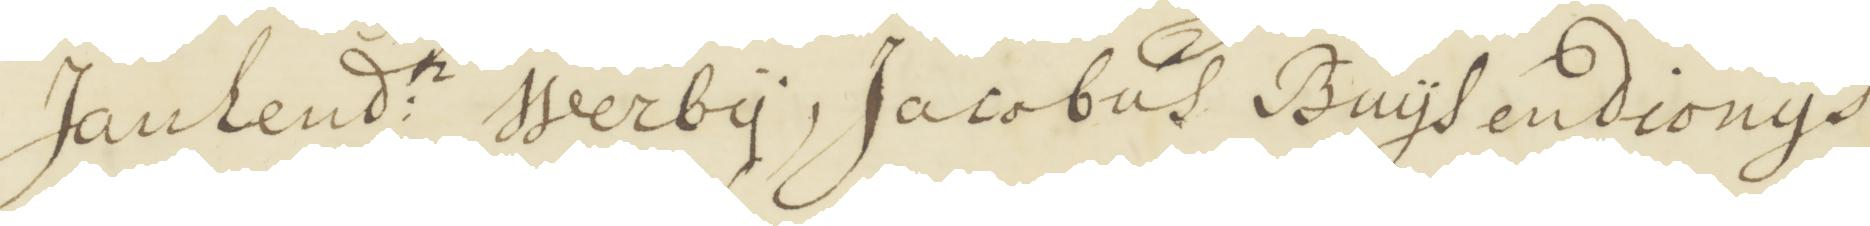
Janhend:k werbij, Jacobus Buijs en dionijs
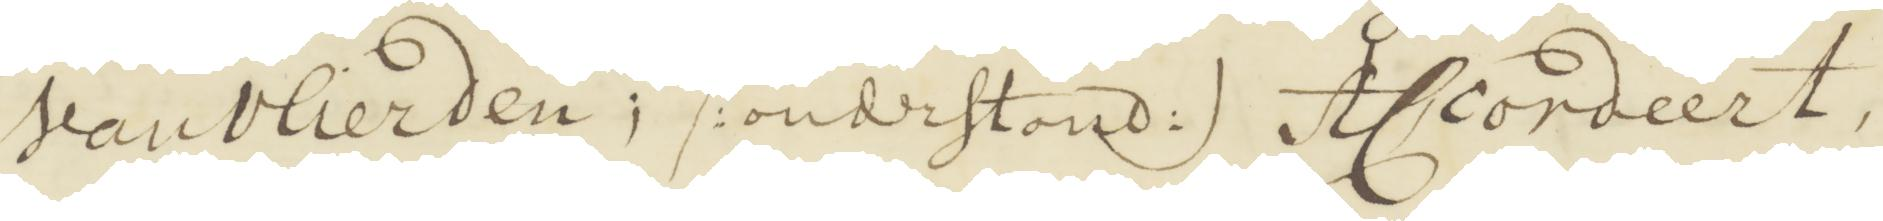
VanVlierden; /:onderstond:/ Accordeert,
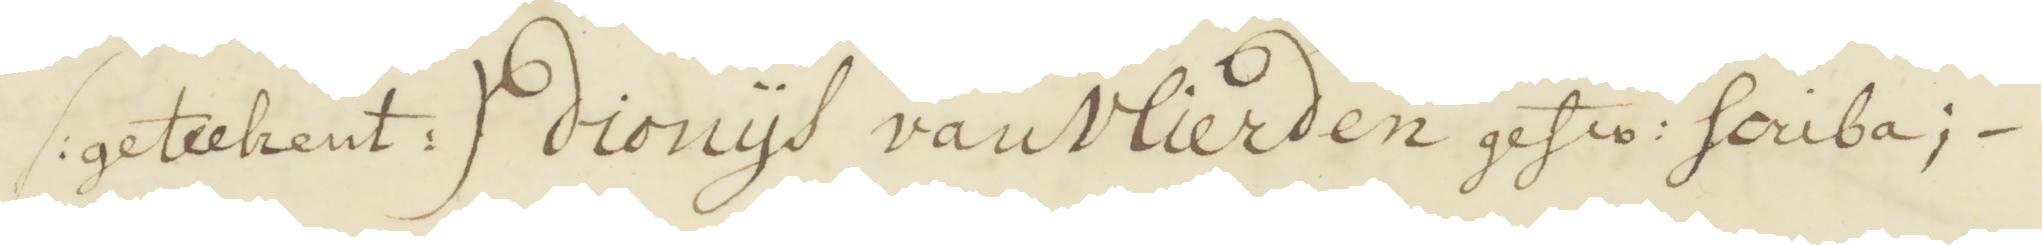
/:geteekent:/ dionijs vanVlierden gesw: scriba; —
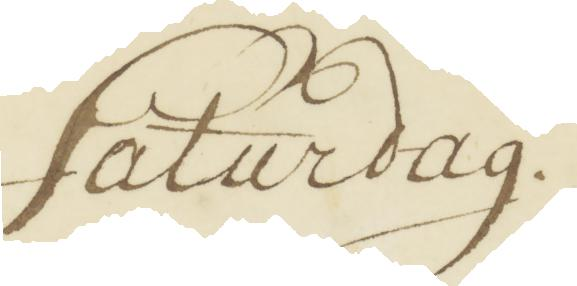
Saturdag.
